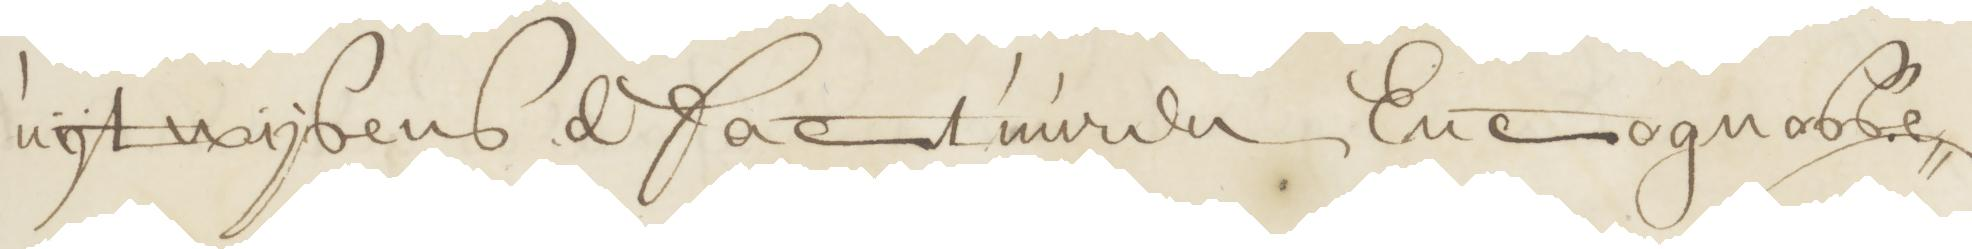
uijt wijsens de factuuren En cognosse„
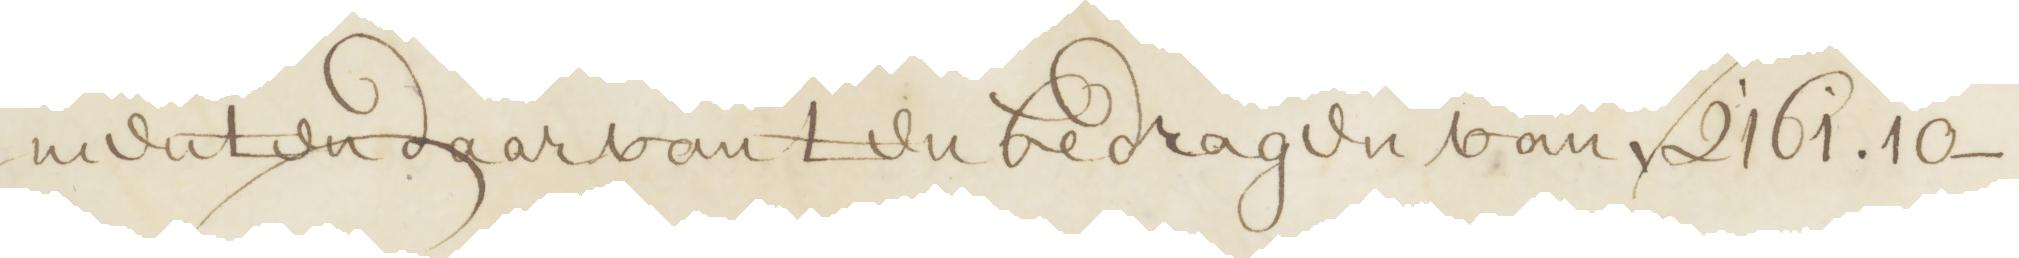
menten daarvan ten bedragen van ƒ2161.10—
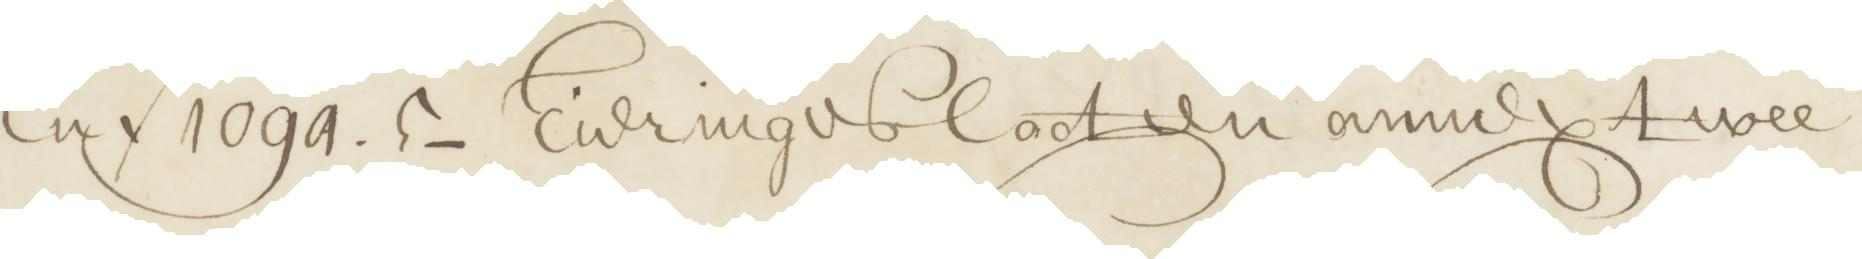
En ƒ1094.5— hier ingeslooten annex twee
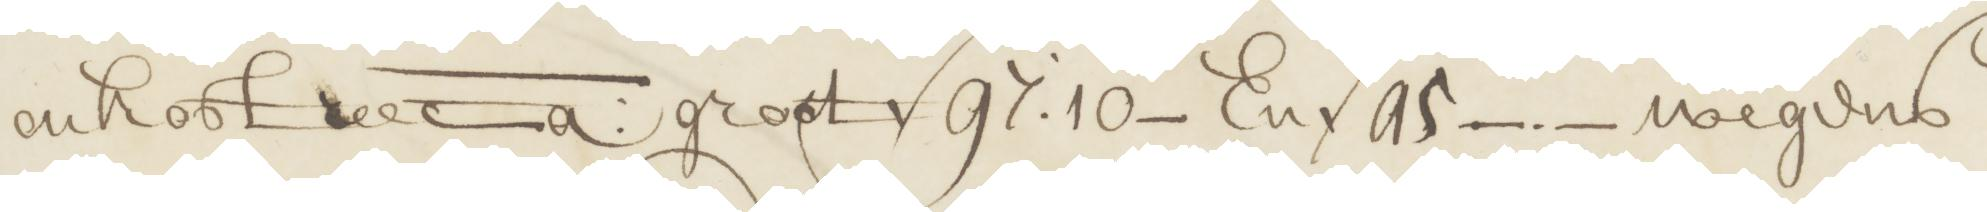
onkost reeca: groot ƒ97:10— En ƒ45—.— wegens
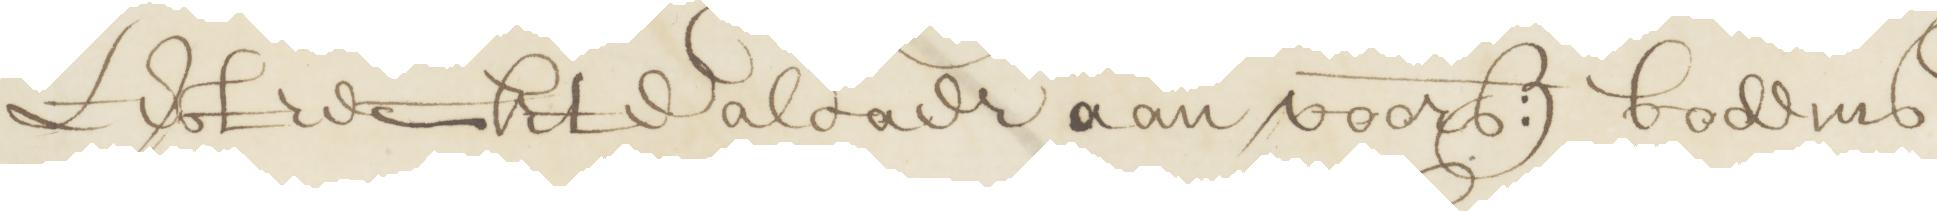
't verstreckte aldaer aan voorsz: bodems
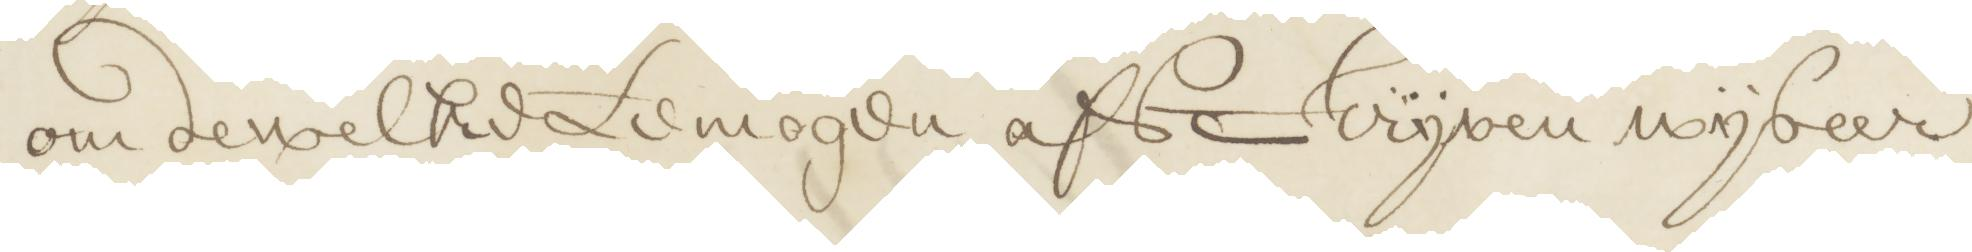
om dewelke te mogen afschrijven wijseer
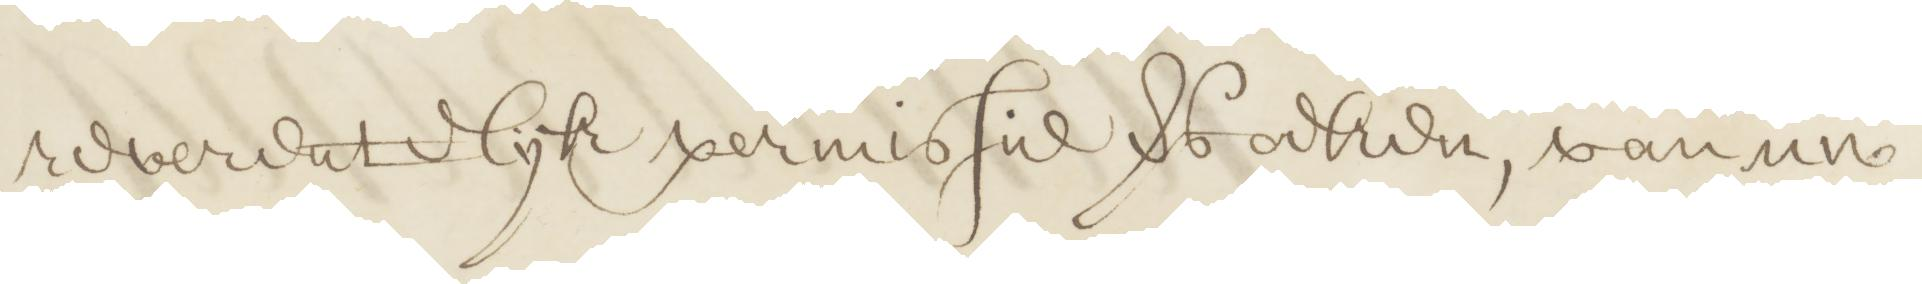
reverentelijk permissie versoeken, van uw
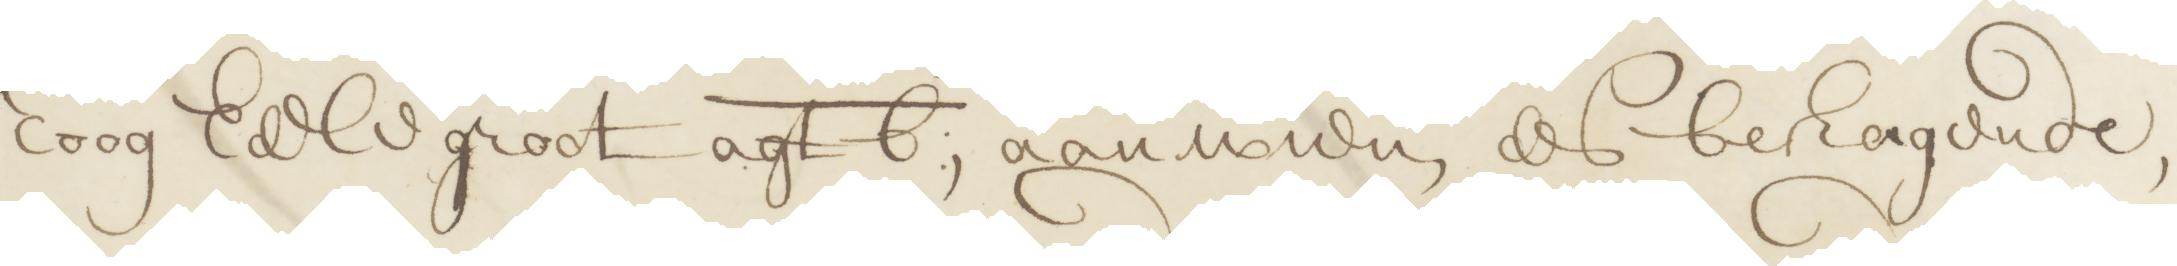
hoog Edele groot agtb:, aan wien, des behagende,
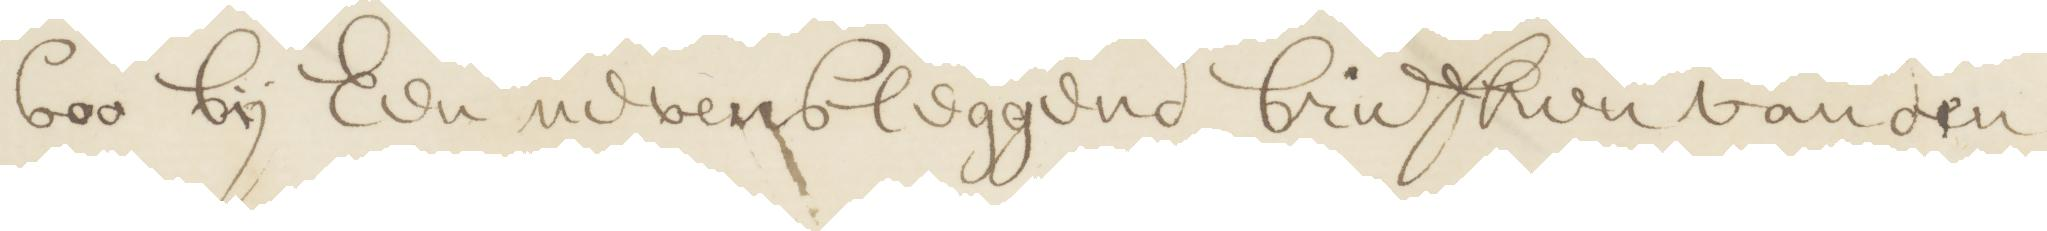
soo bij Een nevensleggend briefken van den
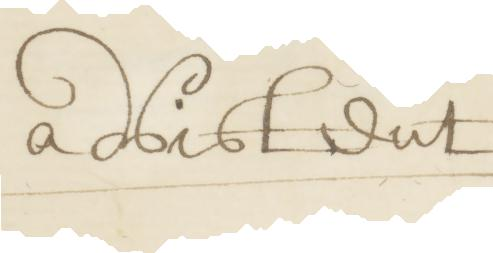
adsistent
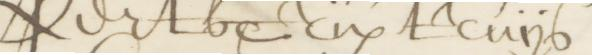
per't schip 't huijs
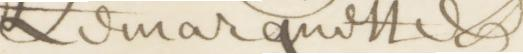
te marquette
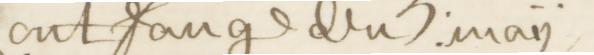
ontfange den 5: maij
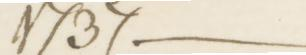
1737 —
